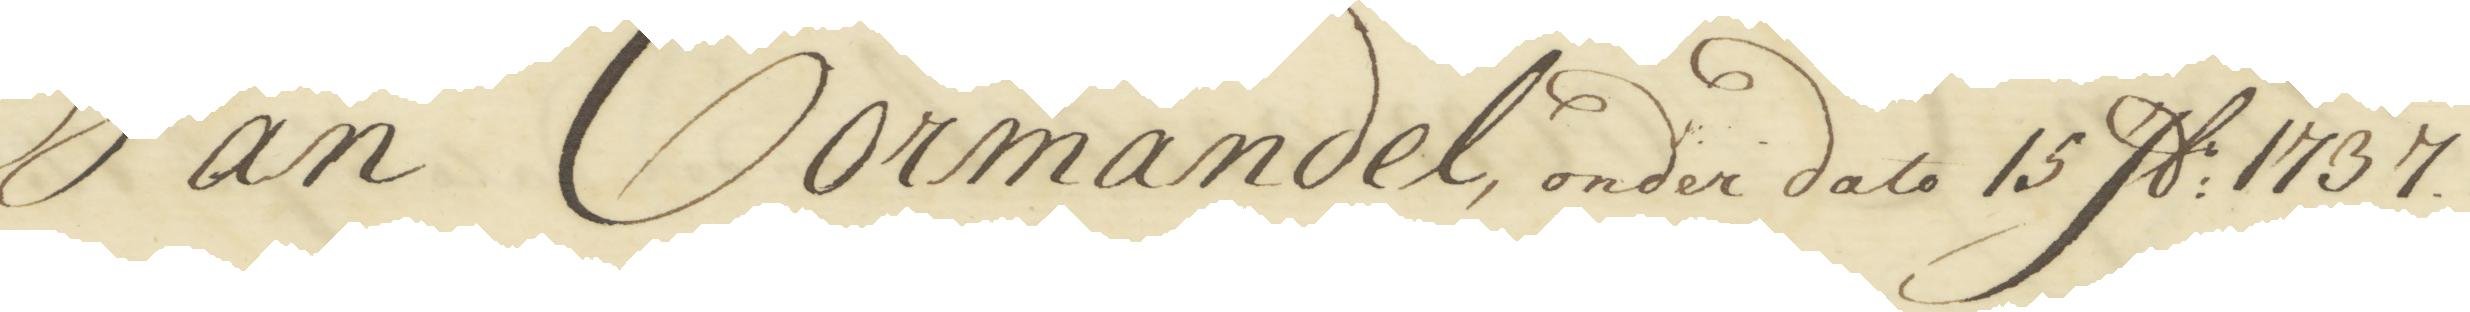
Van Cormandel, onder dato 15 Jb:r 1737.
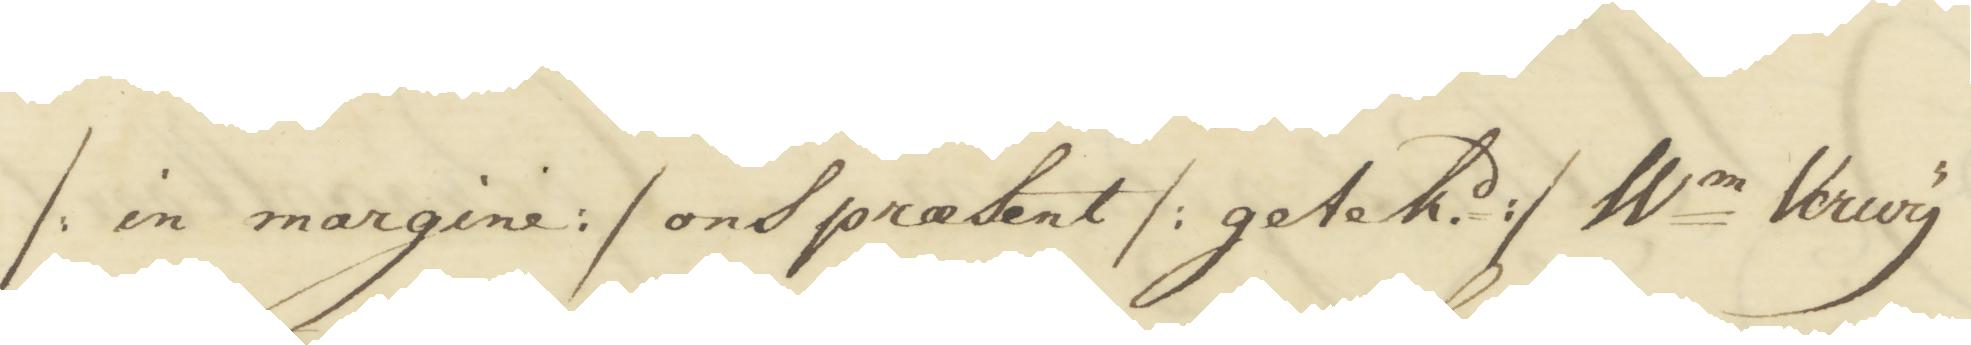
/:in margine:/ ons praesent /:getek:d:/ W=m Verwij
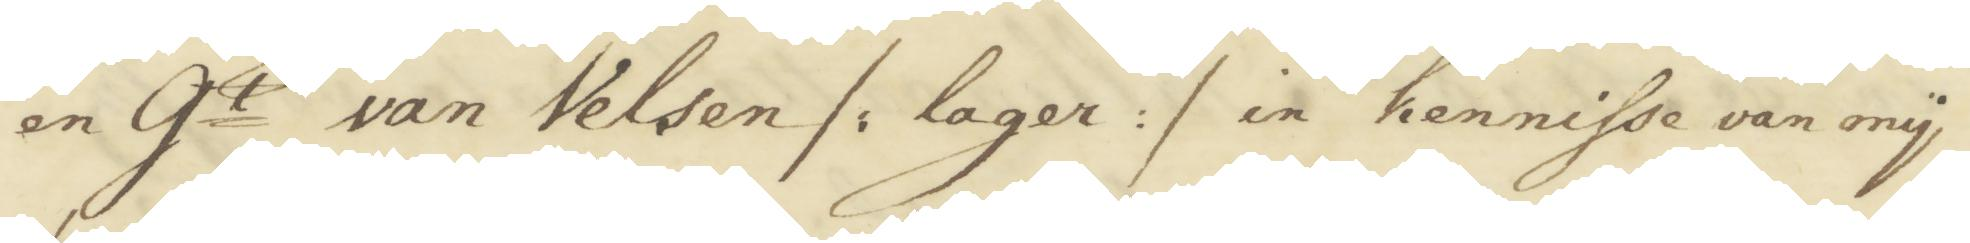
en G=t van Velsen /:lager:/ in kennisse van mij
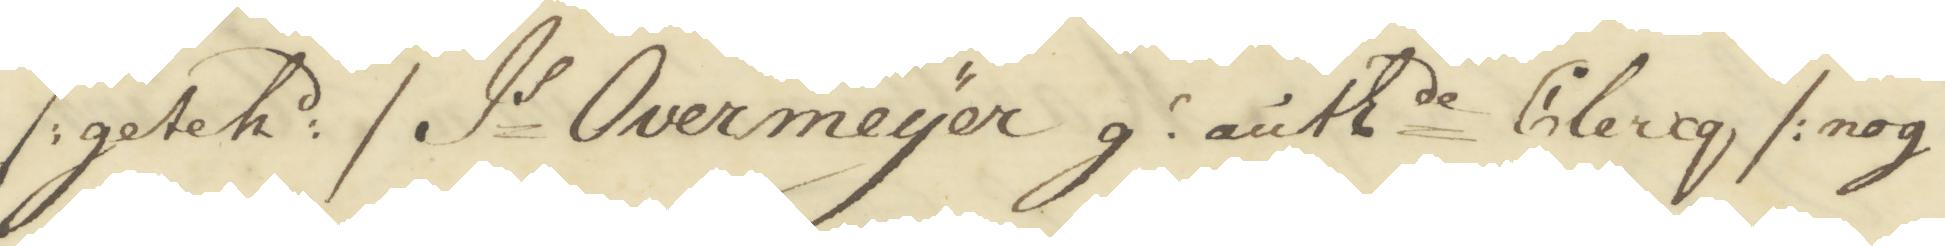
/:getek:d/ J=s Overmeijer g.'auth=de Clercq /:nog
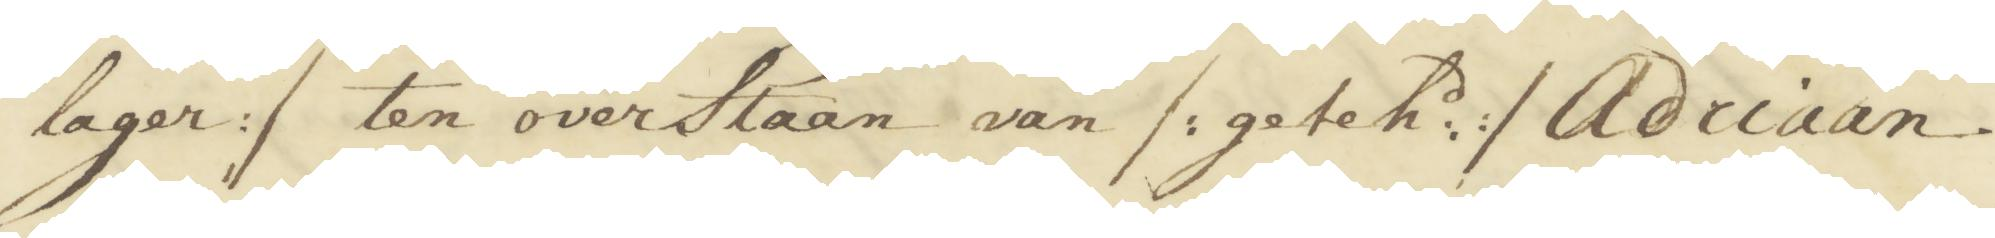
lager:/ ten overstaan van /:getek:d:/ Adriaan
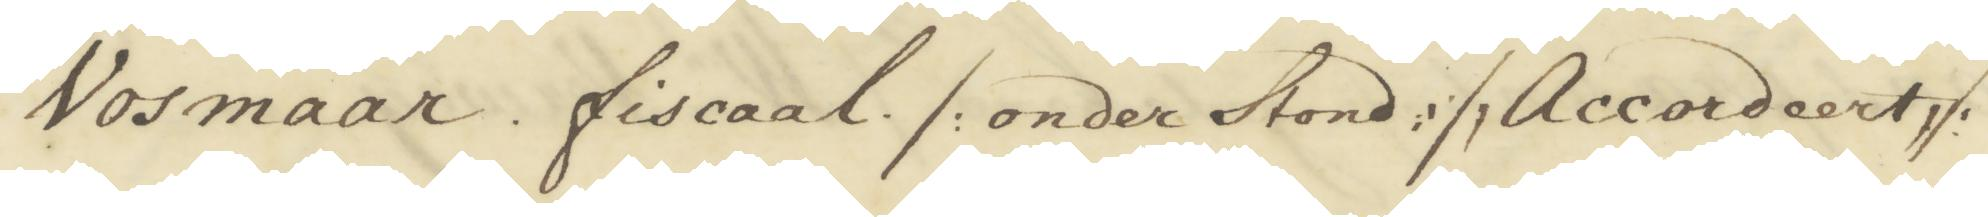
Vosmaar. fiscaal. /:onderstond:/, Accordeert, /:
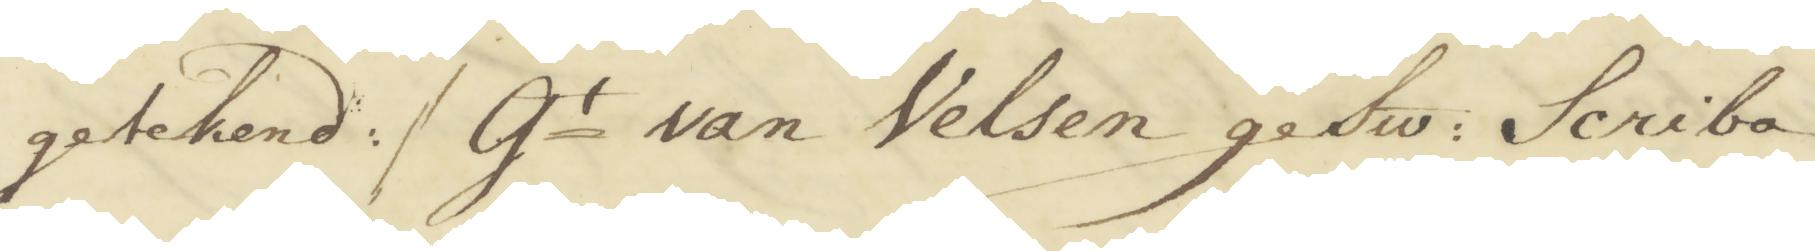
getekend:/ G=t van Velsen gesw: scriba
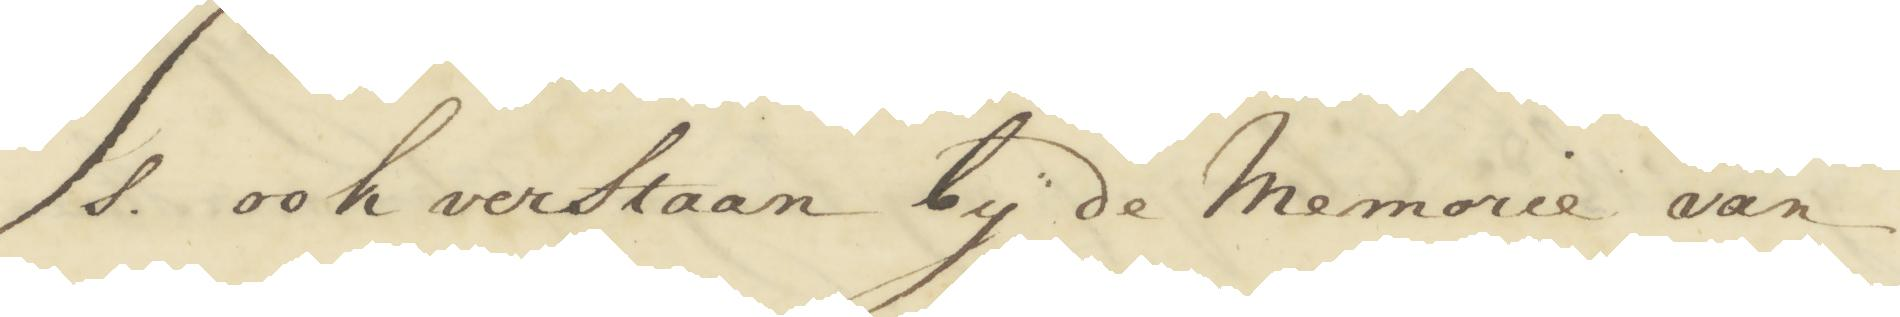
Js ook verstaan bij de memorie van
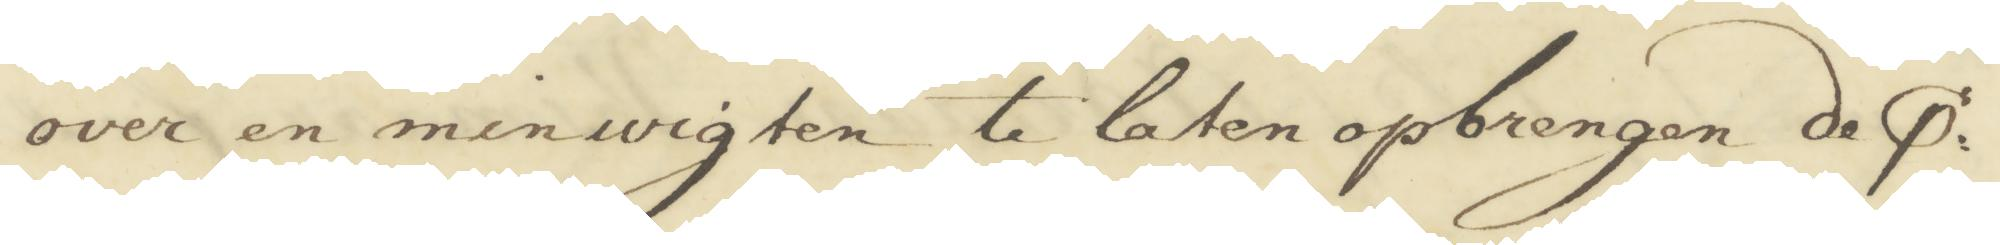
over en minwigten te laten opbrengen de p:r
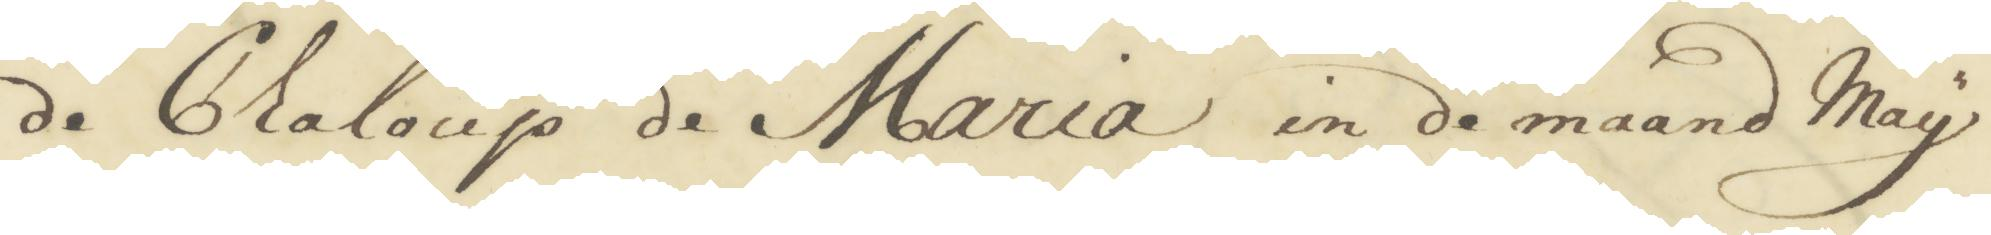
de Chaloup de Maria in de maand Maij
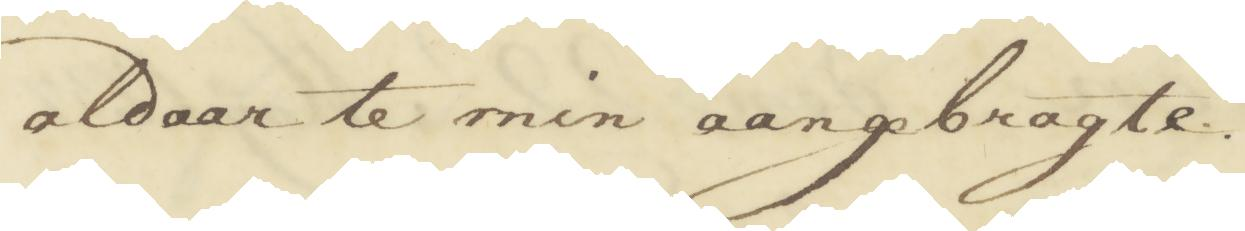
aldaar te min aangebragte.
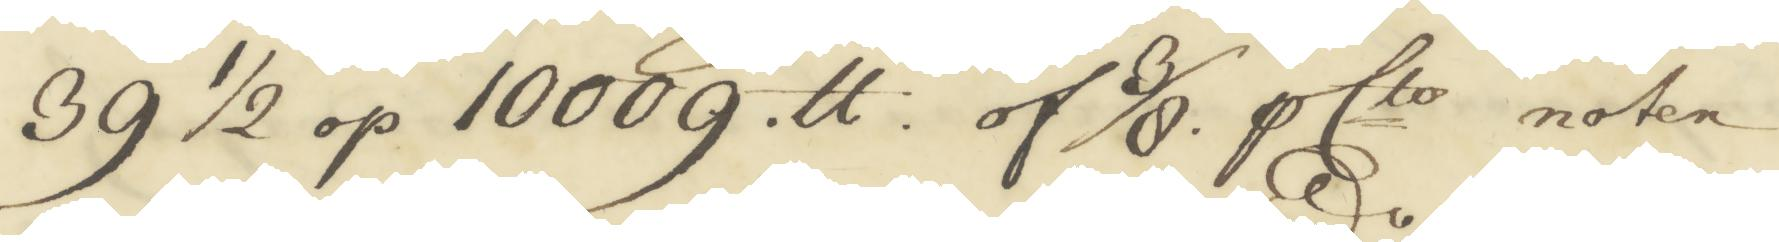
39½ op 10009. lb: of 3/8. pC=to noten
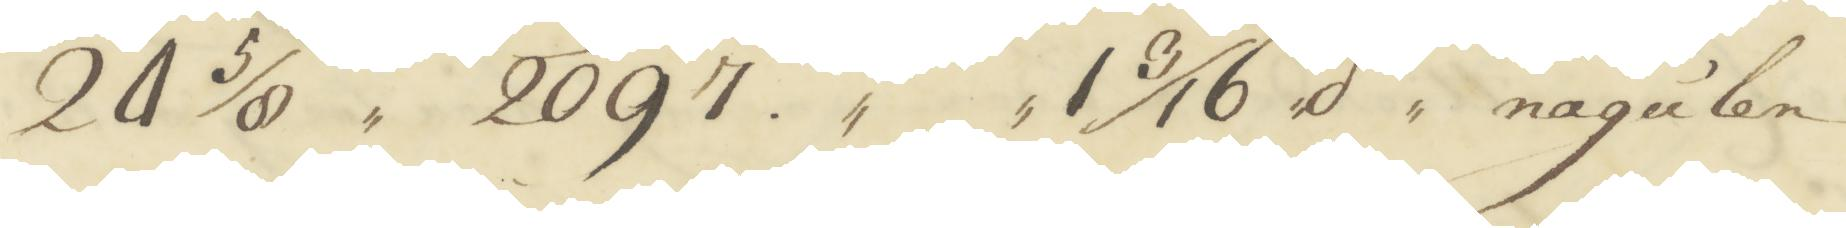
24 5/8 „ 2097. „ „ 1 3/16 „ d„o nagulen
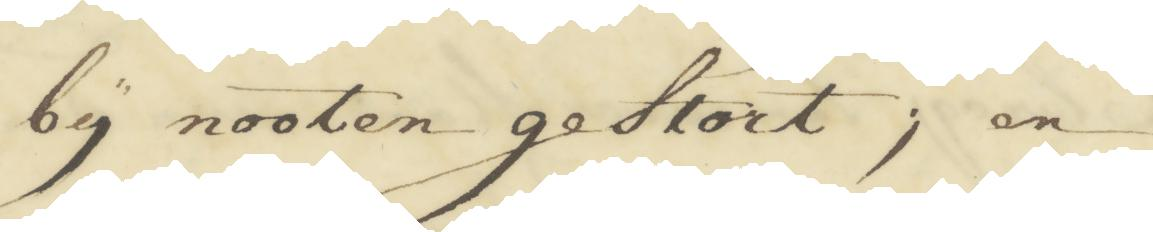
bij nooten gestort; en
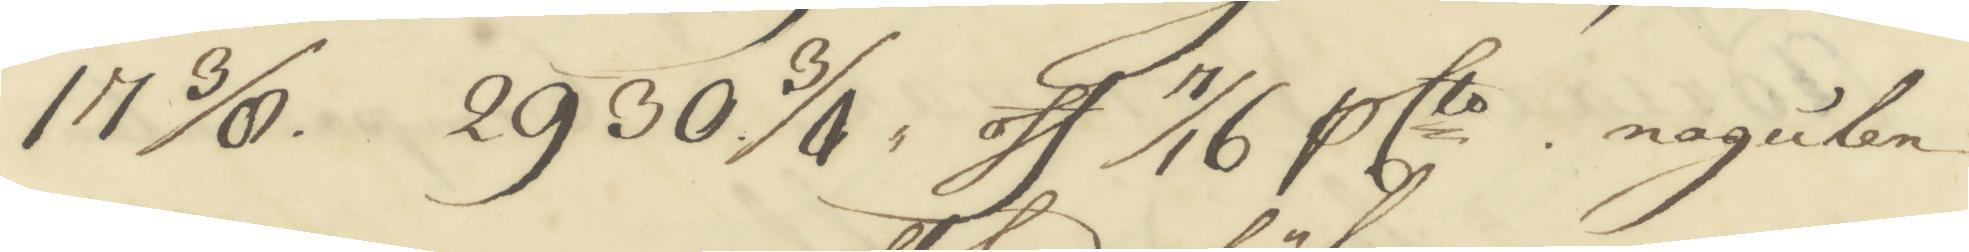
17 3/8. 2930.¾ „ off 7/16 pC=to . nagulen
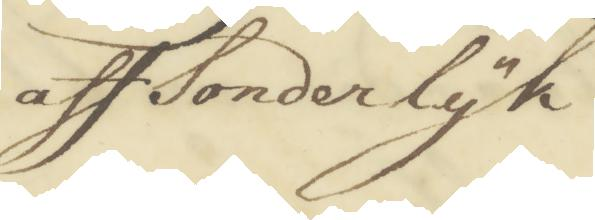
affsonderlijk
